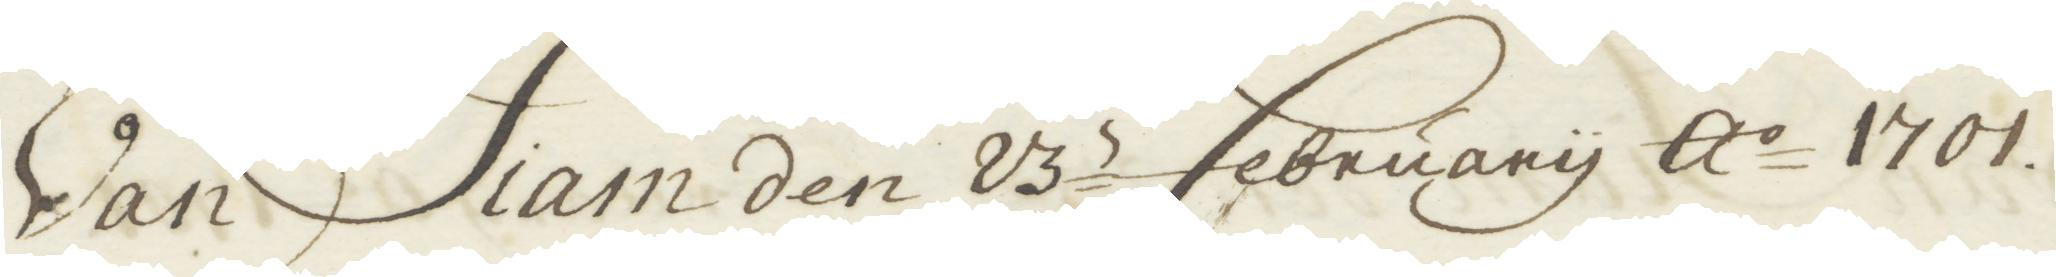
Van Siam den 23=' Februarij A=o 1701.
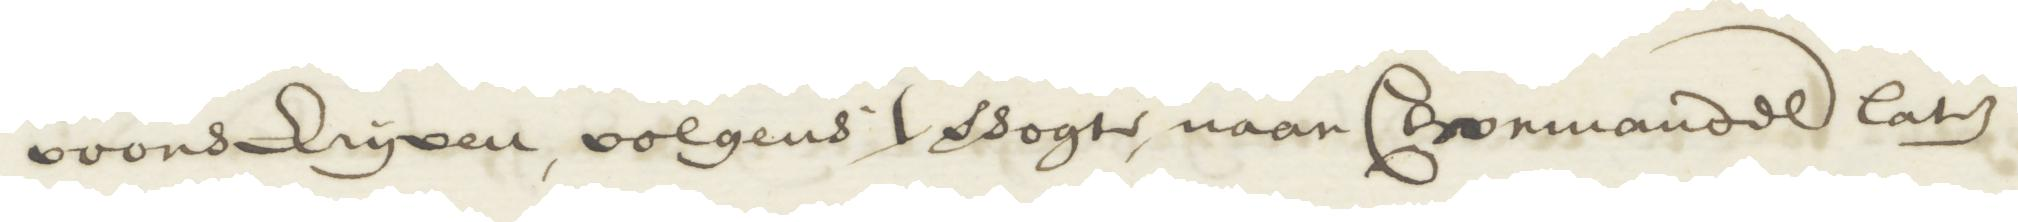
voorschrijven, volgens 't versogte, naar Corormandel laten
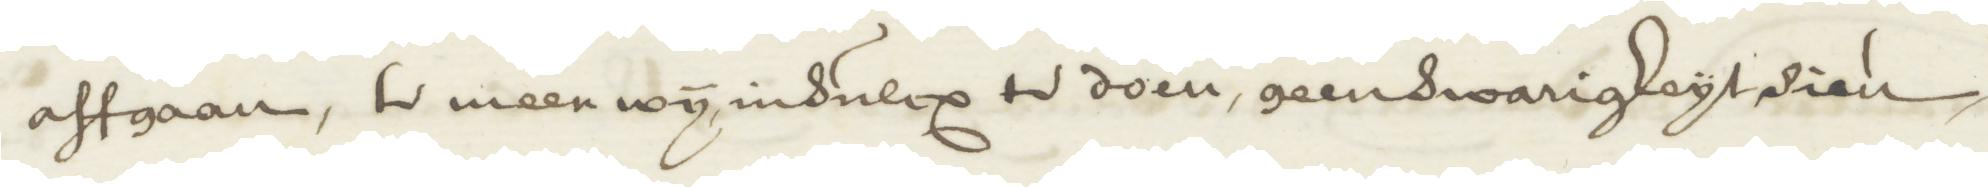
affgaan, te meer wij in sulcx te doen, geen swarigheijt sien,
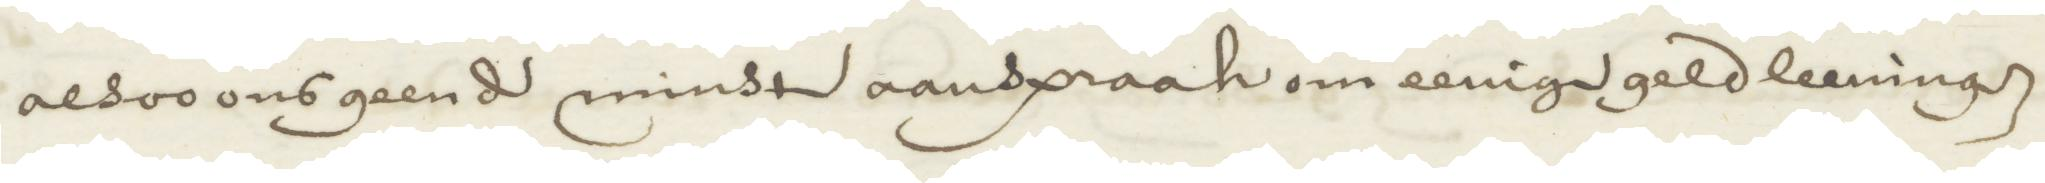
alsoo ons geen de minste aanspraak om eenige geldleeningen
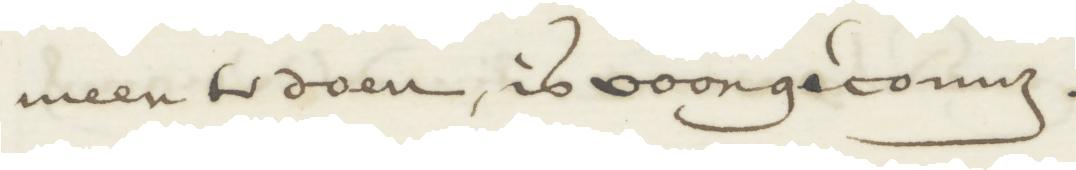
meer te doen, is voorgecomen.
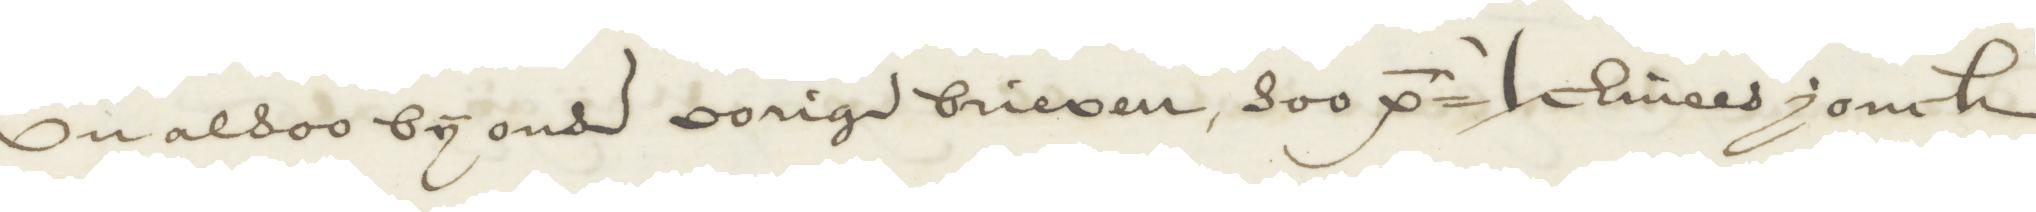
En alsoo bij onse vorige brieven, soo p=r 't chinees jonck
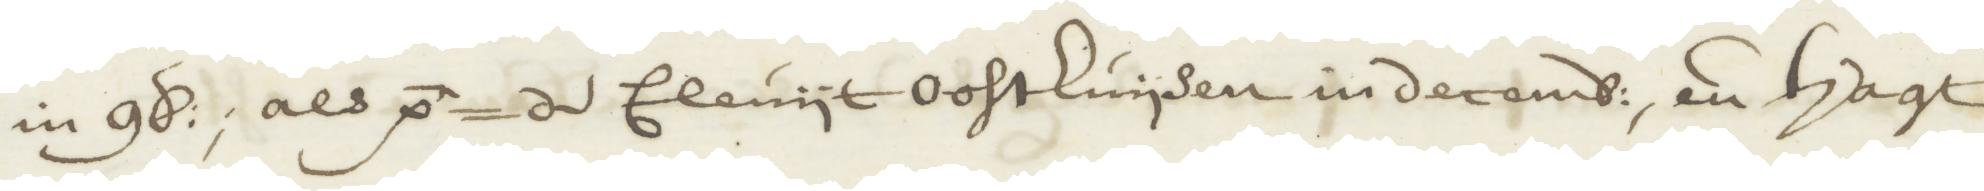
in 9br: ; als p=r de fleuijt Oosthuijsen in decemb:, en t jagt
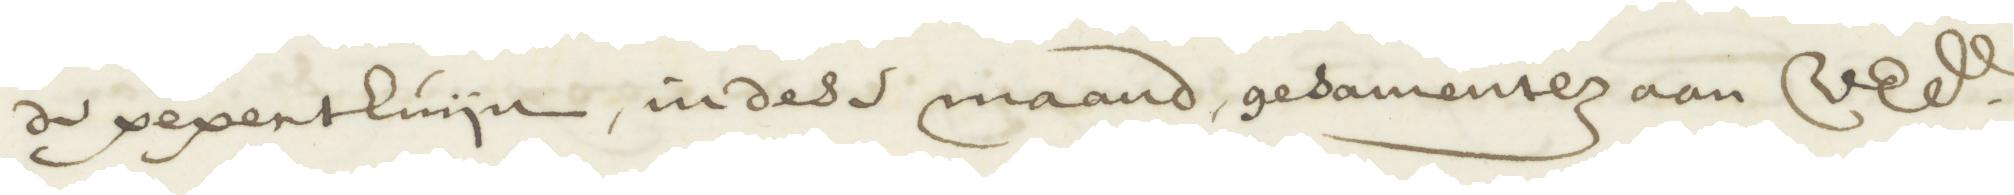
de peperthuijn, in dese maand gesamentlijk aan vEde.
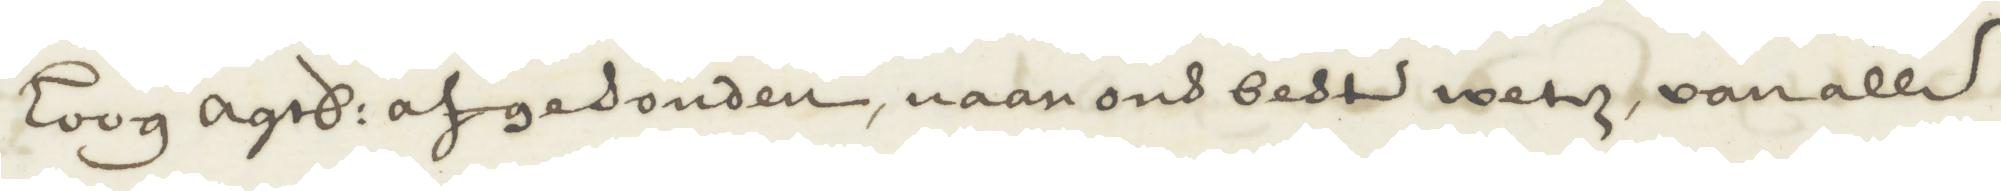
hoog agtb: afgesonden, naar ons beste weten, van alle
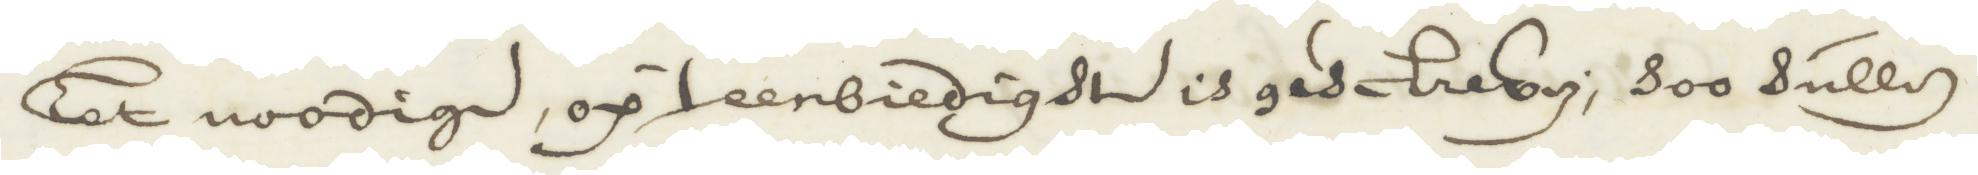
het noodige, op 't eerbiedigste is geschreven; soo sullen
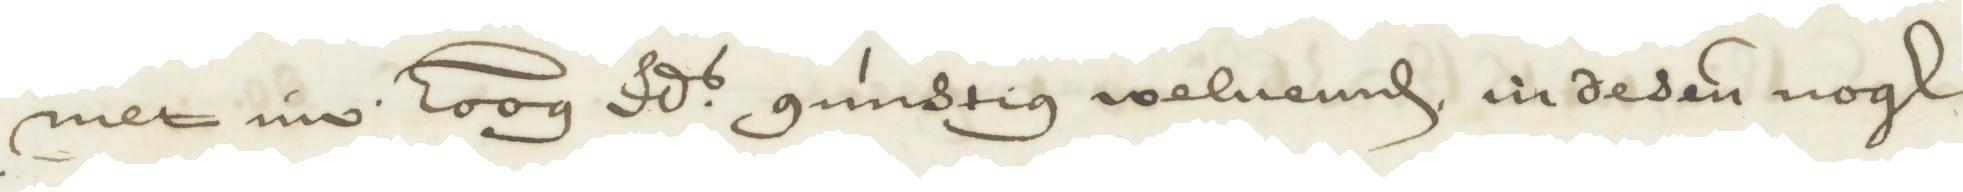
met uw. hoog Ed.s gunstig welnemen, in desen nogh
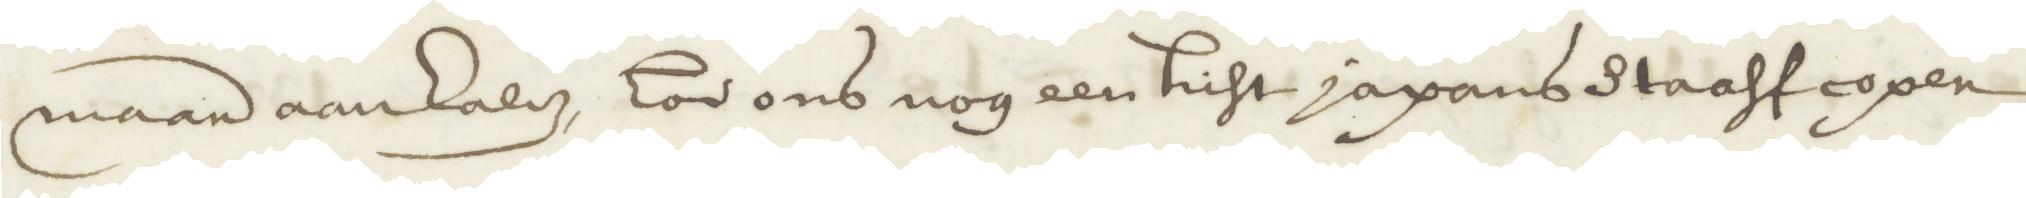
maar aanhalen, hoe ons nog een kist japans staaff coper,
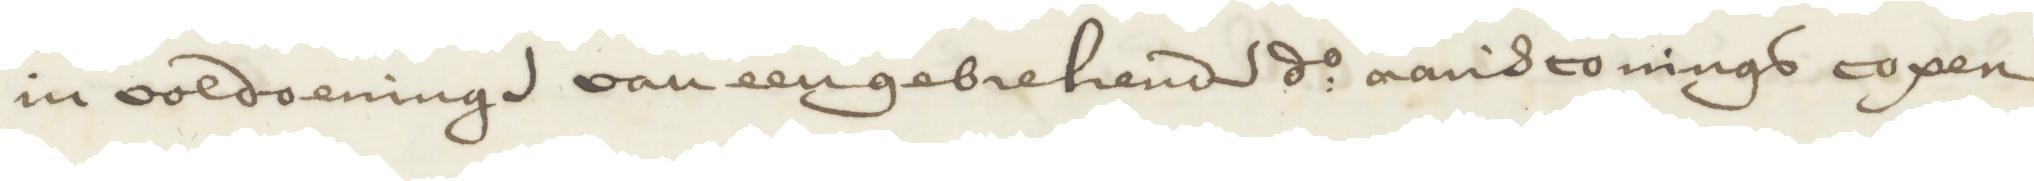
in voldoeninge van een gebrekende d:o aan 's conings coper,
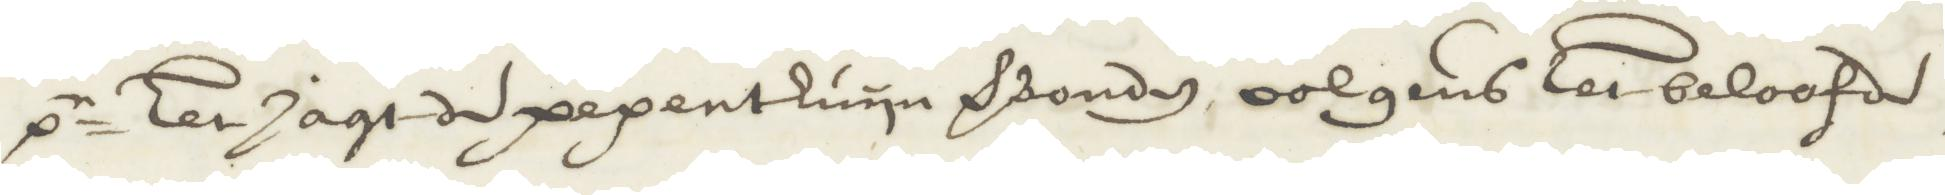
p=r het jagt de peperthuijn versonden, volgens het beloofde
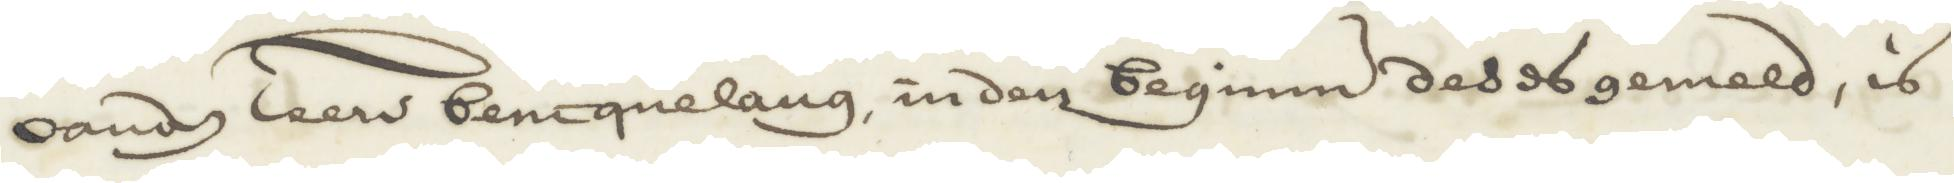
van den heere bencquelang, in den beginne deses gemeld, is
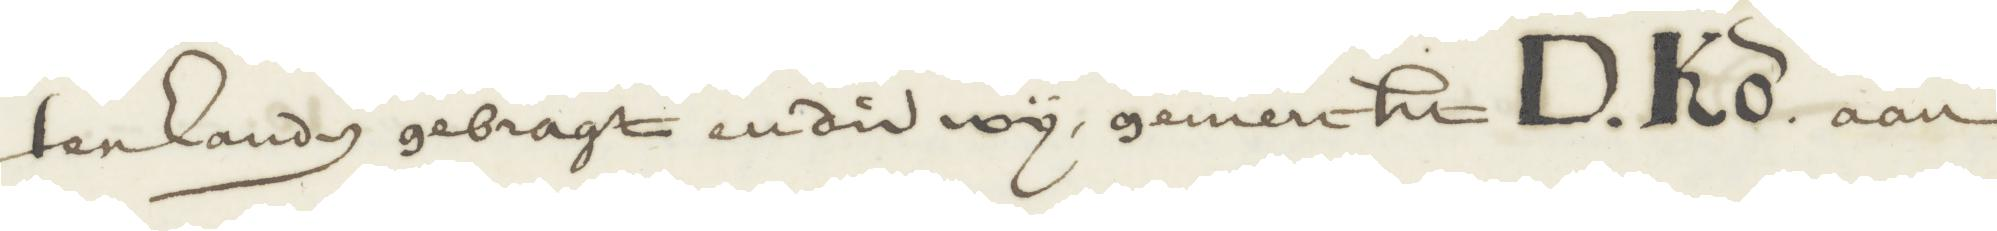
ten landen gebragt en die wij, gemercht D. Ko. aan
